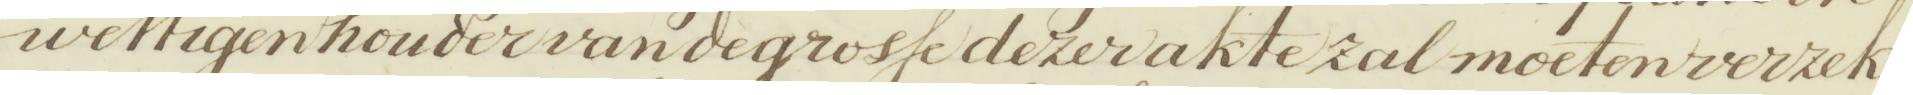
wettigen houder van de grosse dezer akte zal moeten verzeke
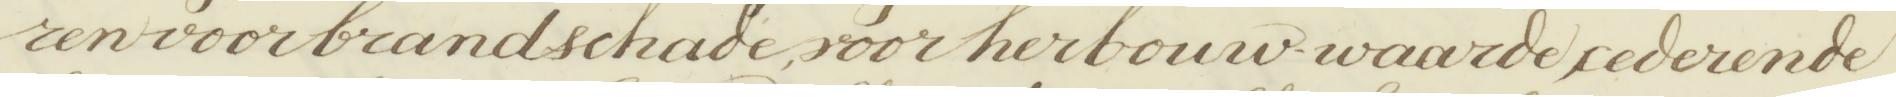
ren voorbrandschade, voor herbouw waarde cederende
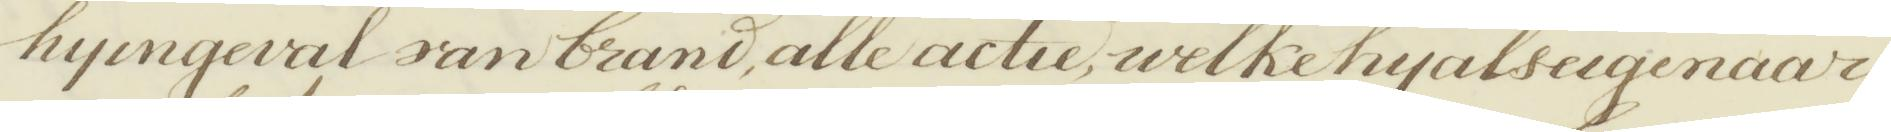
hy ingeval van brand, alle actie, welke hy als eigenaar
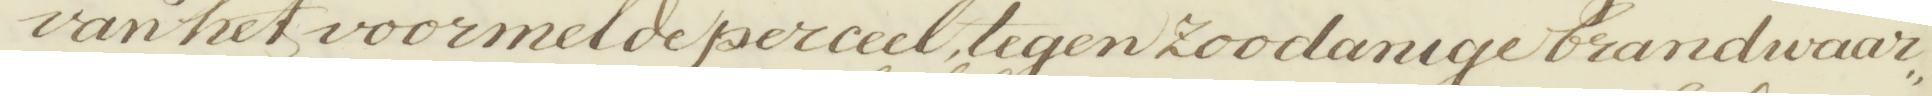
van het voormelde perceel, tegen zoodanige brandwaar„
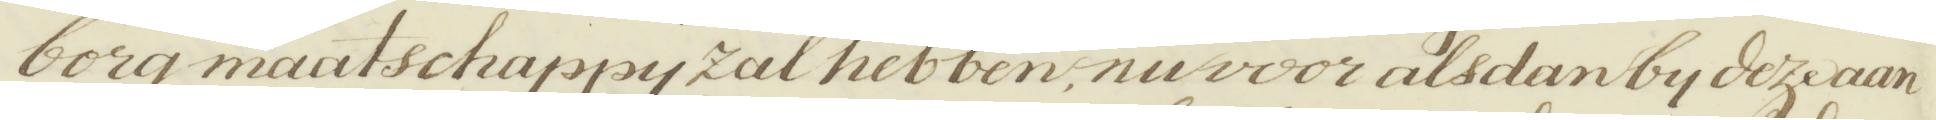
borg maatschappy zal hebben, nu voor als dan by deze aan
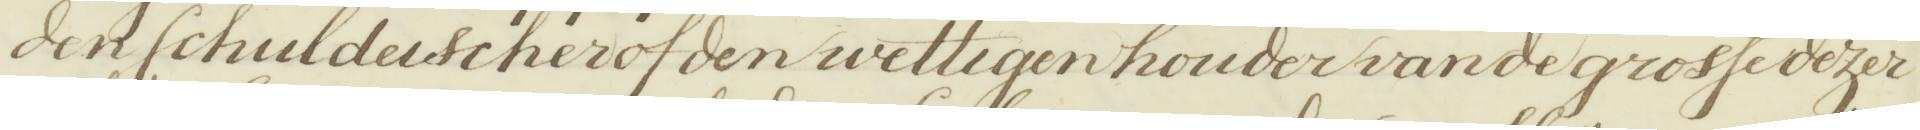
den Schuldeischer of den wettigen houder van de grosse dezer
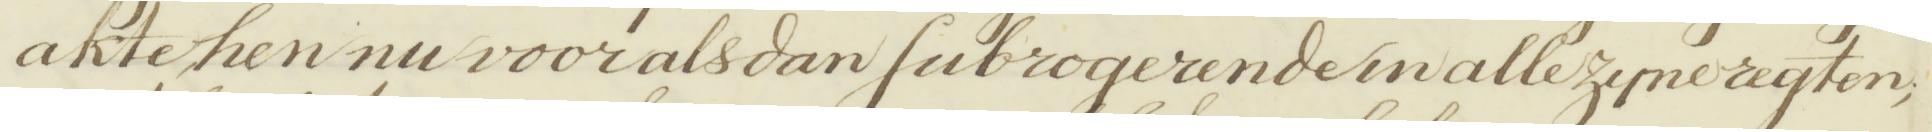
akte hen nu voor als dan Subrogerende in alle zyne regten;
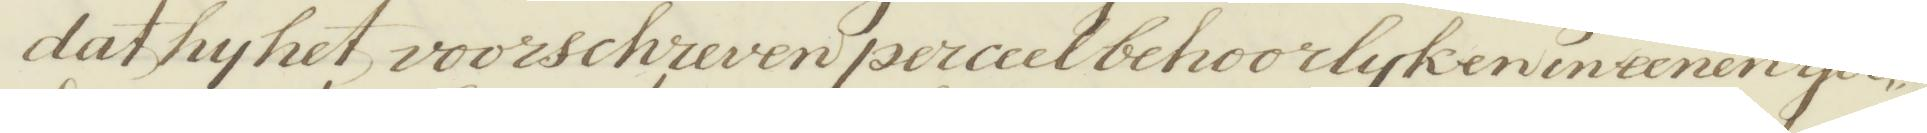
dat hy het voorschreven perceel behoorlyk en in eenen goe„
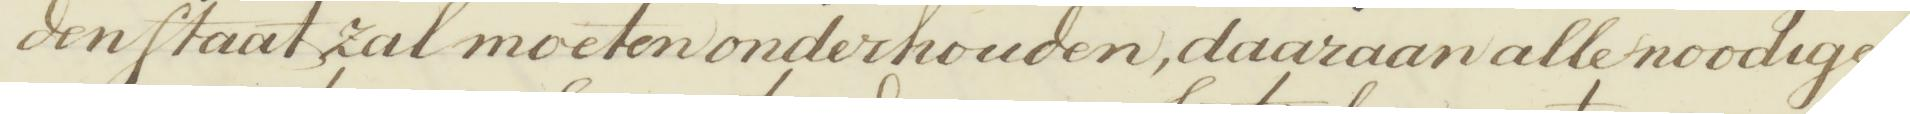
den Staat zal moeten onderhouden, daaraan alle noodige
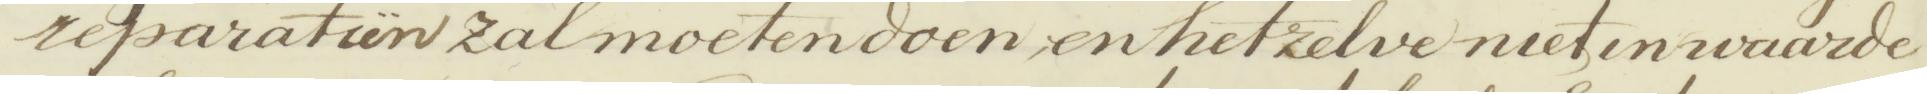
reparatien zal moeten doen, en hetzelve niet in waarde
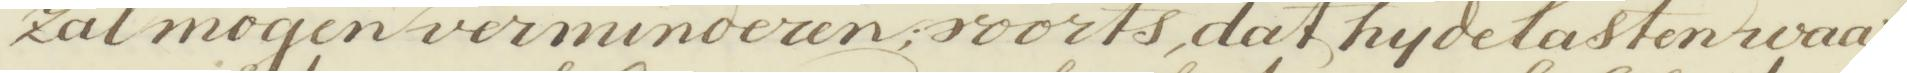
zal mogen verminderen voorts, dat hy de lasten waar
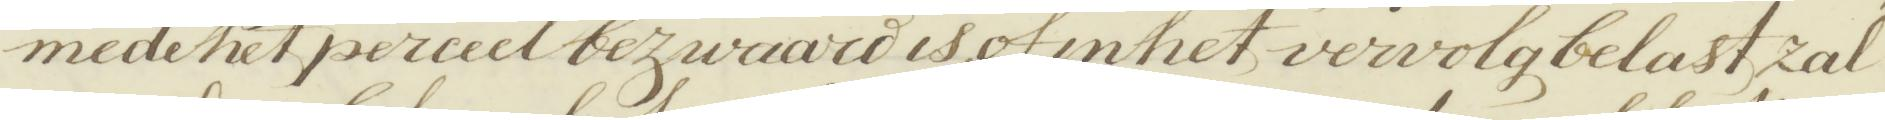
mede het perceel bezwaard is, of in het vervolg belast, zal
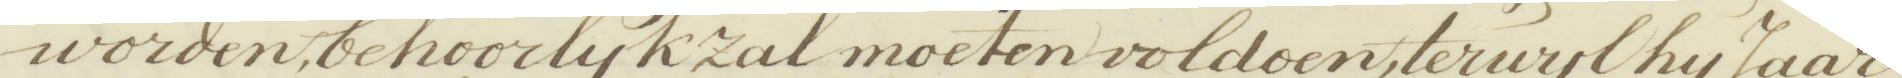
worden, behoorlyk zal moeten voldoen, terwyl hy Jaar
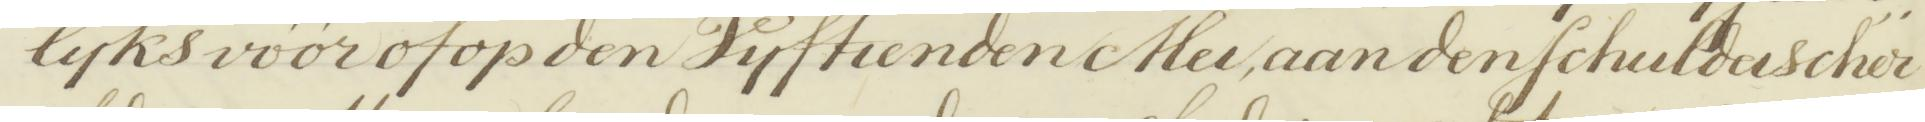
lyks vóór of op den Vyftienden Mei, aan den Schuldeischer
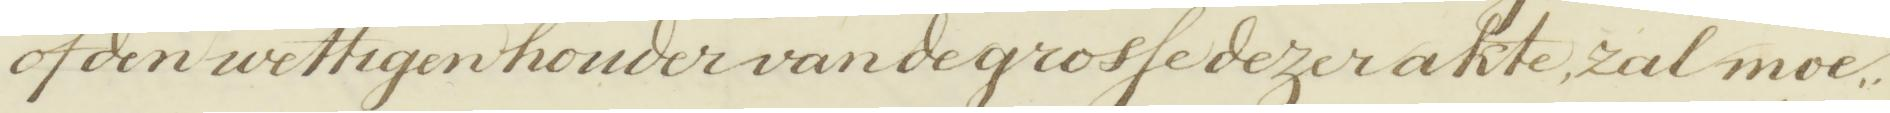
of den wettigen houder van de grosse deze akte, zal moe„
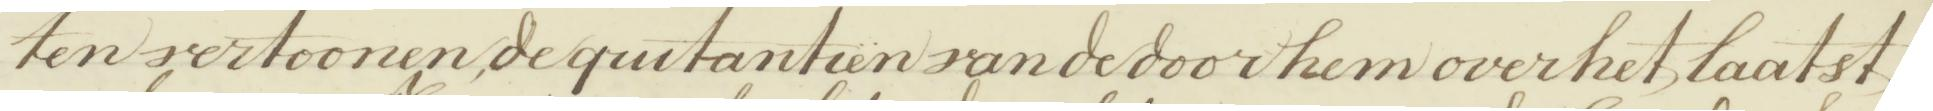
ten vertoonen, de quitantien van de door hem over het laatst
